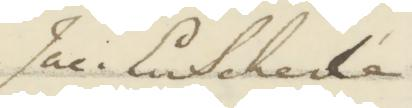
Jac. Enschedé
